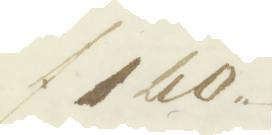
ƒ 140„
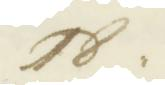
18 „
